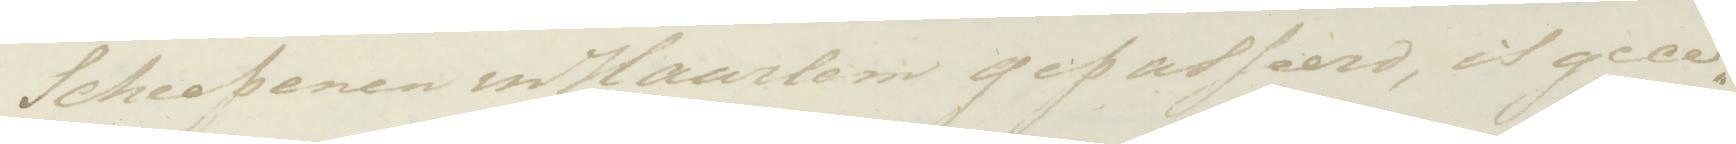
scheepenen in Haarlem gepasseerd, is gece„
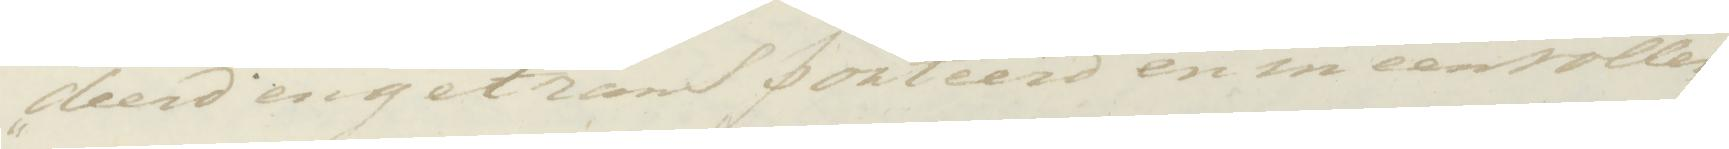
„deerd en getransporteerd en in een vollen
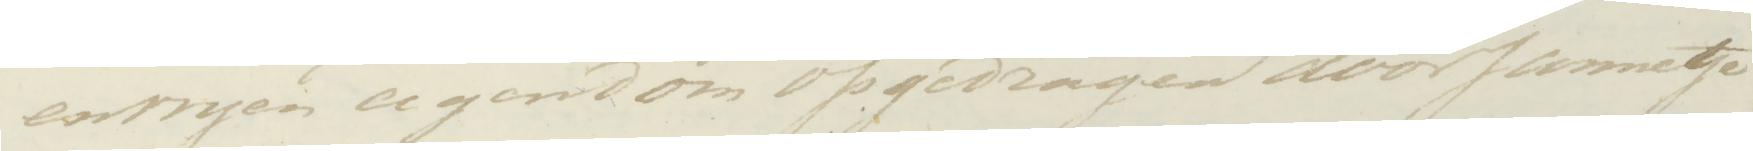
en vryen eigendom opgedragen door Jannetje
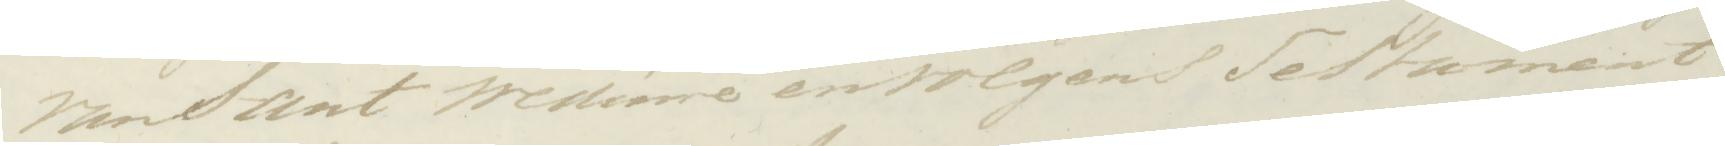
van Sant weduwe en volgens Testament
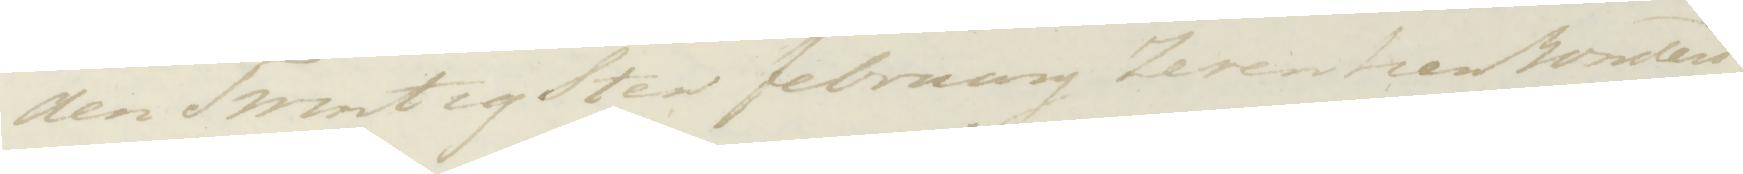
den Twintigsten february zeventien honderd
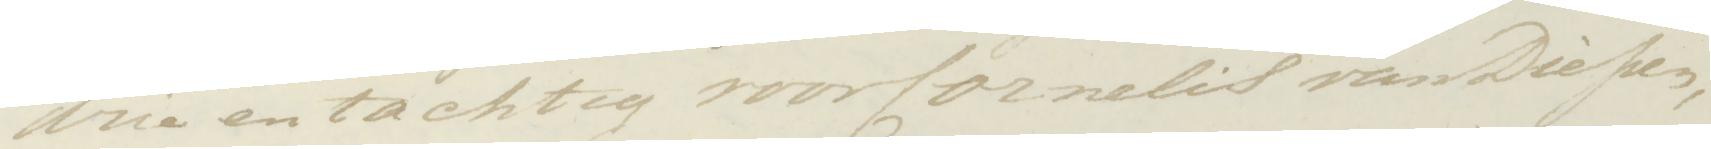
drie en tachtig voor Cornelis van Diepen,
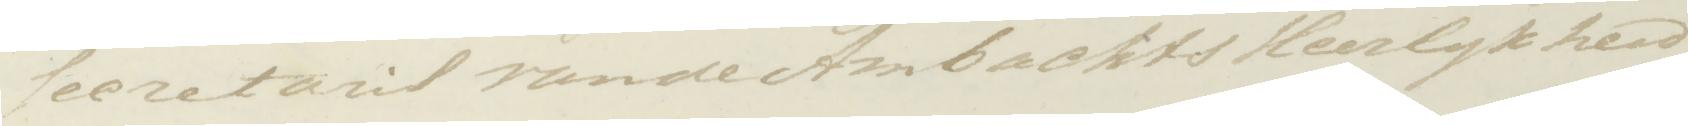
secretaris van de Ambachts Heerlykheid
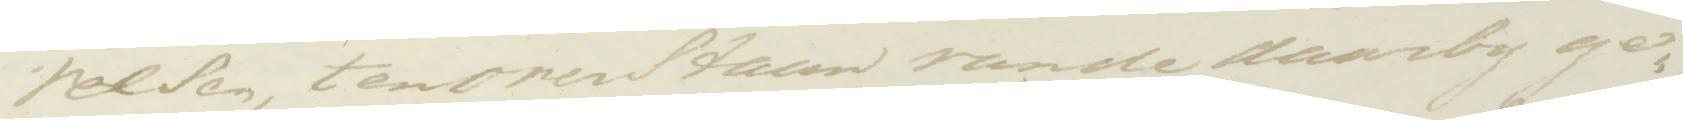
velsen, ten overstaan van de daarby ge„
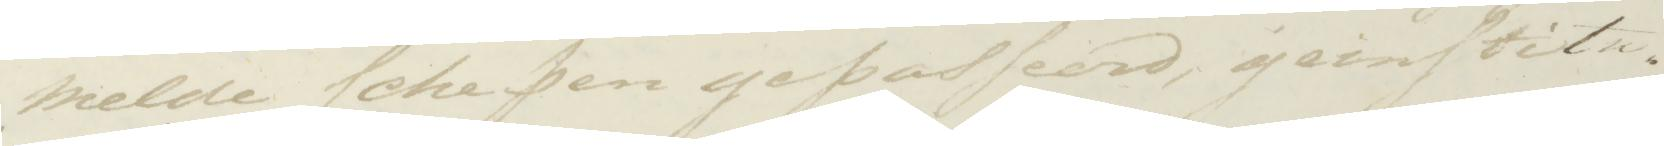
„melde schepen gepasseerd, geinstitu„
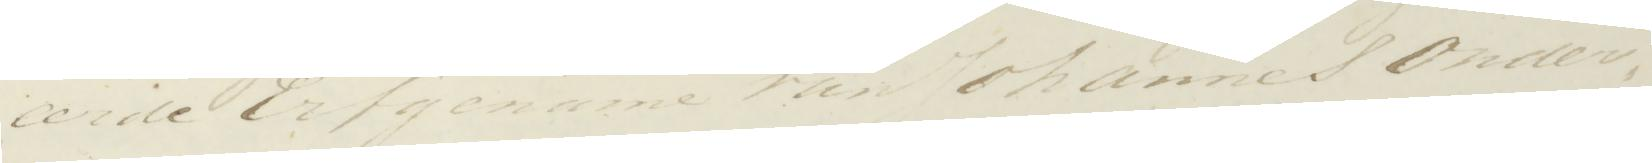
eerde Erfgename van Johannes Onder„
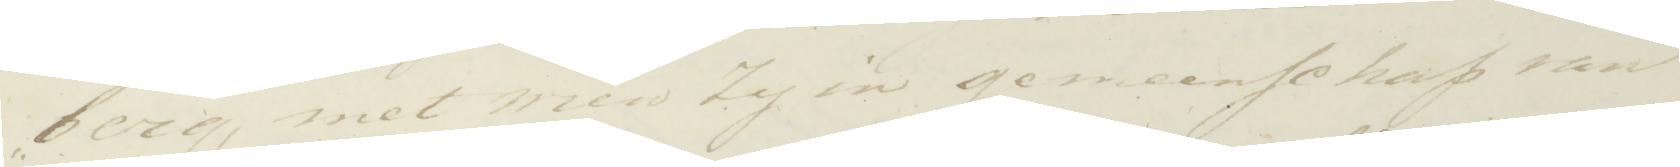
„berg, met wien zy in gemeenschap van
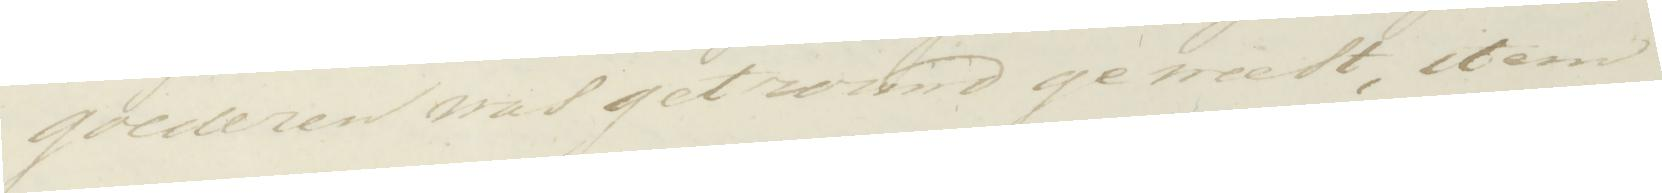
goederen was getrouwd geweest, item
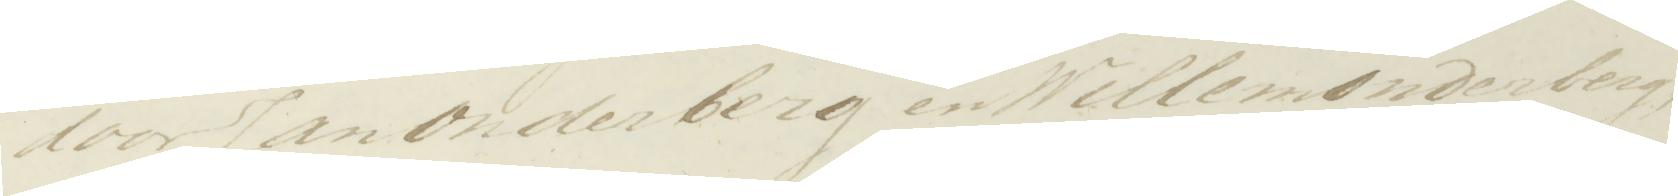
door Jan Onderberg en Willem Onderberg,
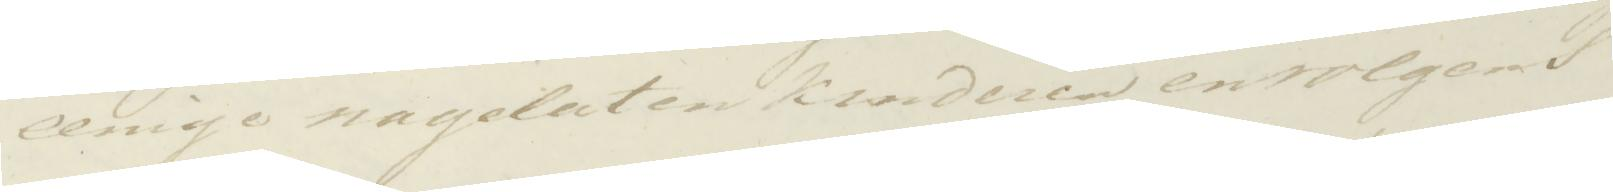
eenige nagelaten kinderen en volgens
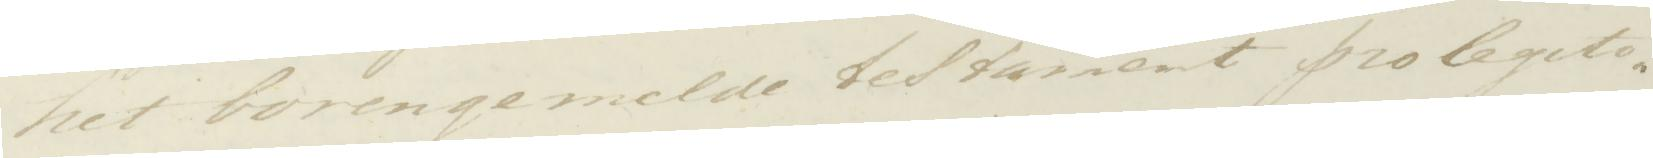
het bovengemelde testament pro legito„
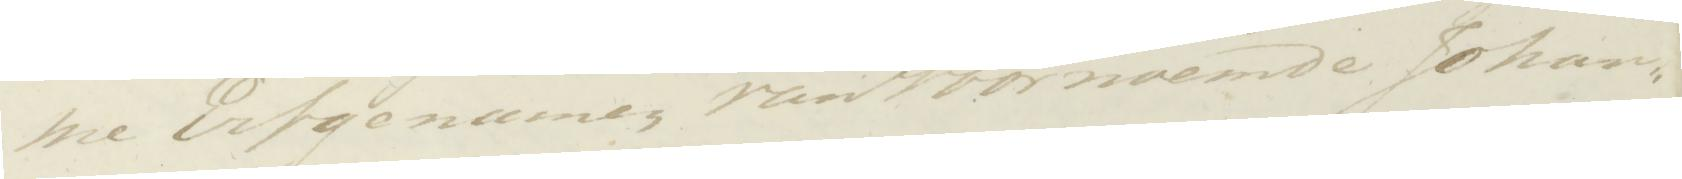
me Erfgenamen van voornoemde Johan„
